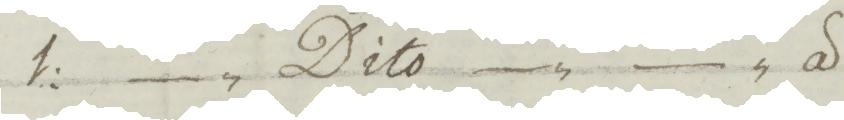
1: —„ Dito —„ —„ a
